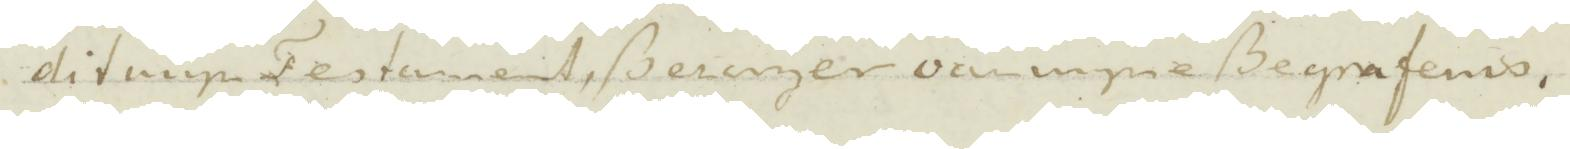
dit myn Testament, Bezorger van myne Begrafenis,
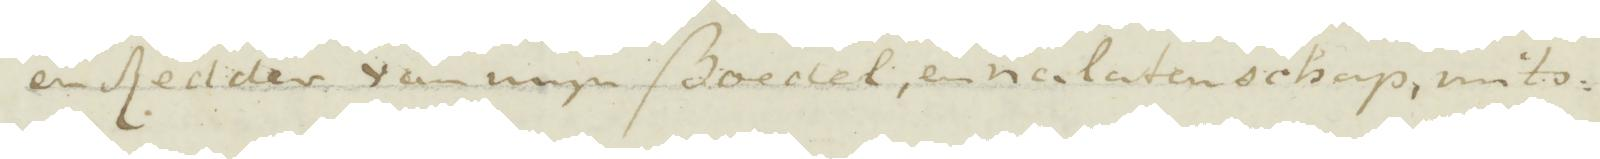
en Redder van myn Boedel, en nalatenschap, mits„
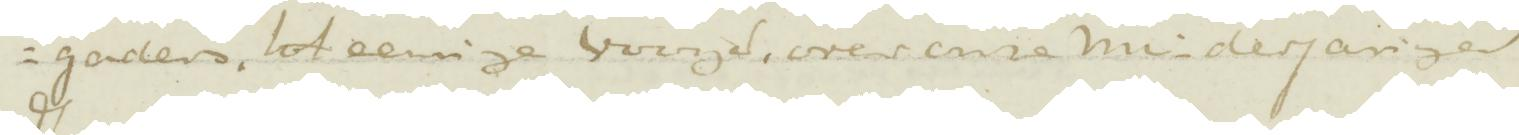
„gaders, tot eeinge voogd, over onze minderjarige
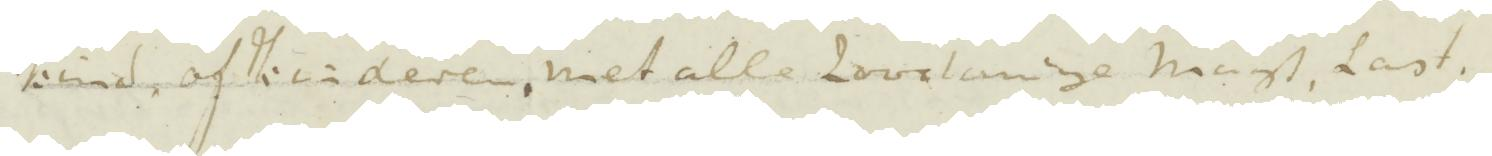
kind, of kinderen, met alle zoodanige magt, last,
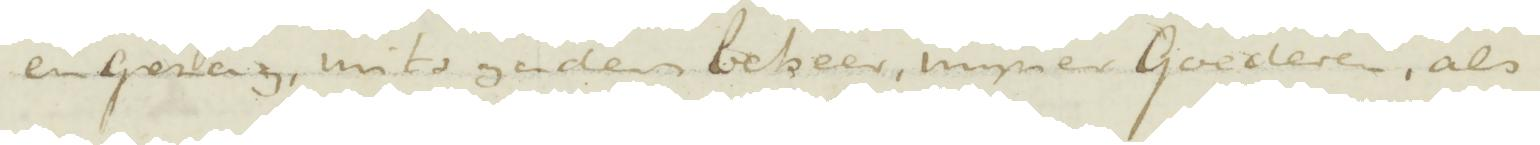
en Gezag, mitsgaders beheer, myner Goederen, als
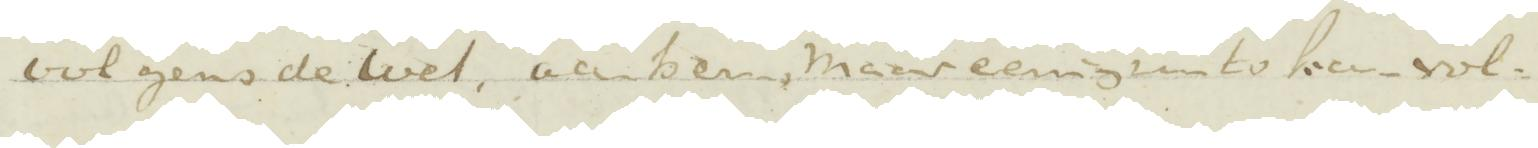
volgens de Wet, aan hem, maar eenigsints kan vol„
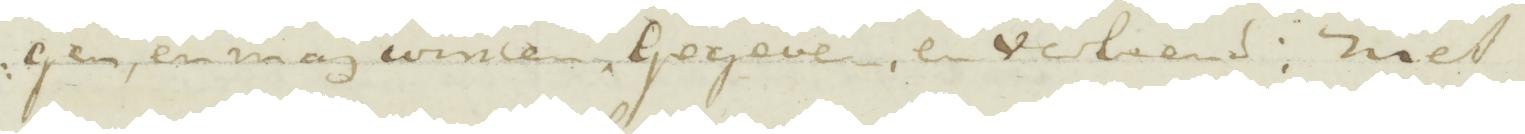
„gen, en mag worden, Gegeven, en verleend: met
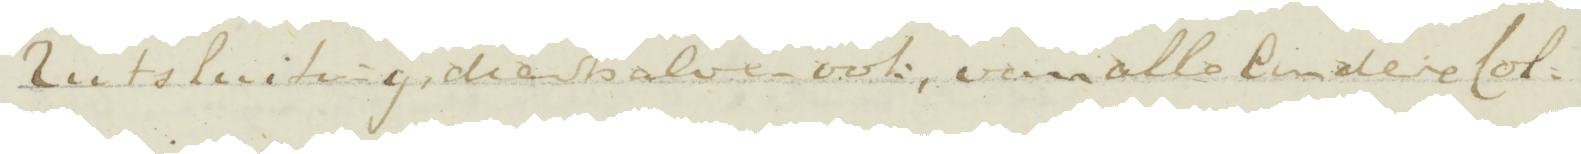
Uitsluiting, dierhalven ook, van alle Andere Col„
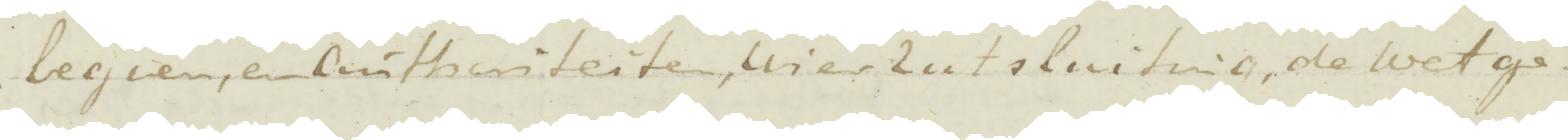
„legien, en Authoriteiten, wier Uitsluiting, de Wet ge„
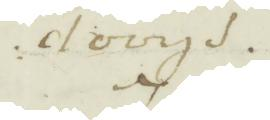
„doogd.
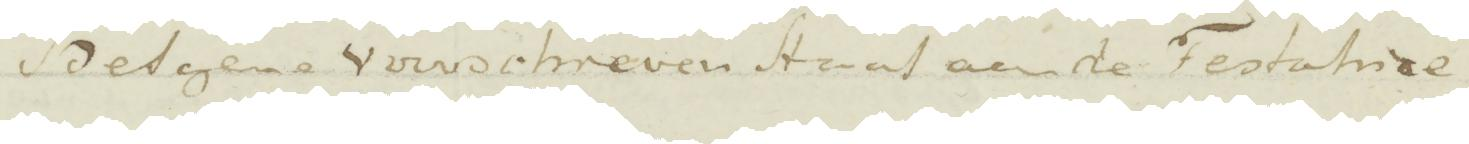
Hetgene voorschreven staat aan de Testatrice
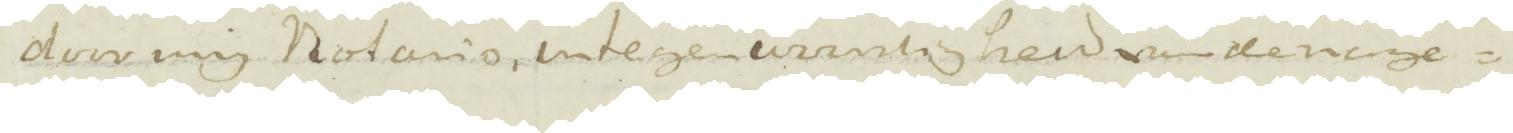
door mij Notaris, in tegenwoordigheid van de nage„
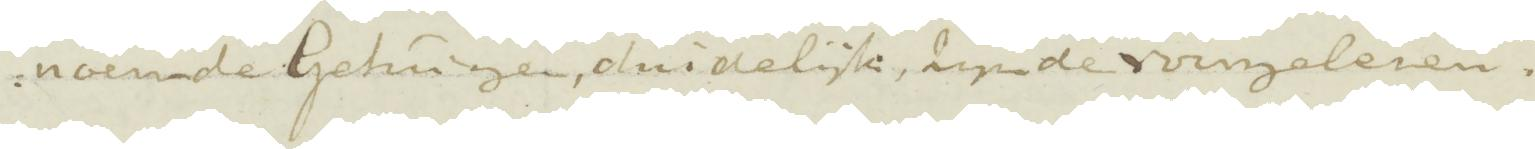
„noemde Getuigen, duidelijk, zynde voorgelezen,
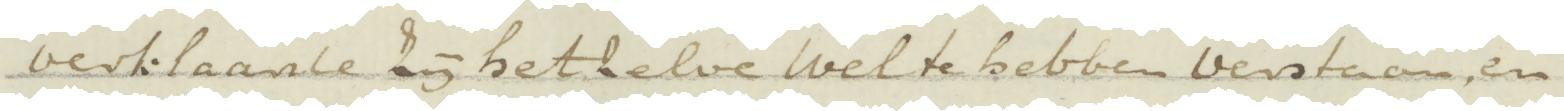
verklaarde zij het zelve wel te hebben verstaan, en
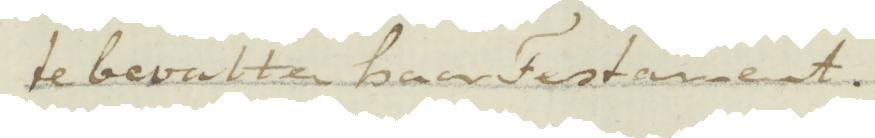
te bevatten haar Testament.
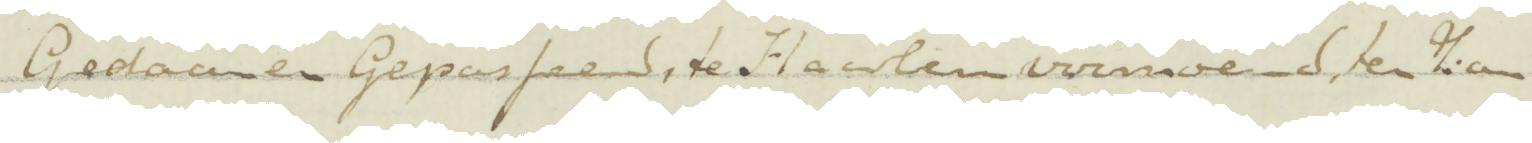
Gedaan en Gepasseerd, te Haarlem voornoemd, ten kan
